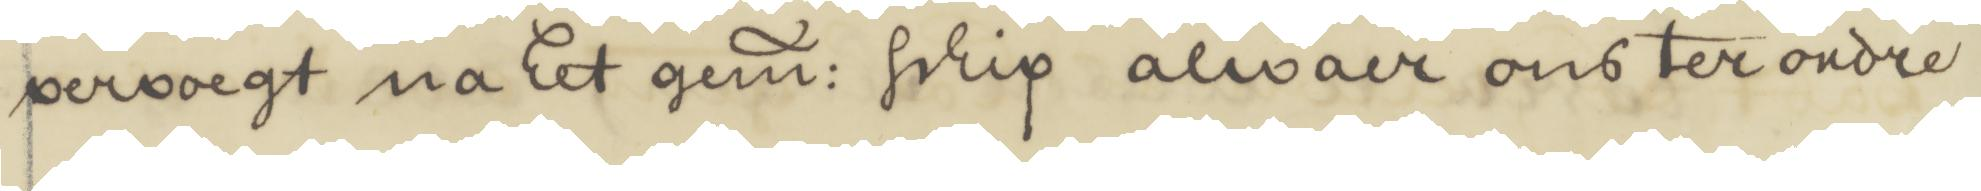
vervoegt na het gem: schip alwaer ons ter ordre
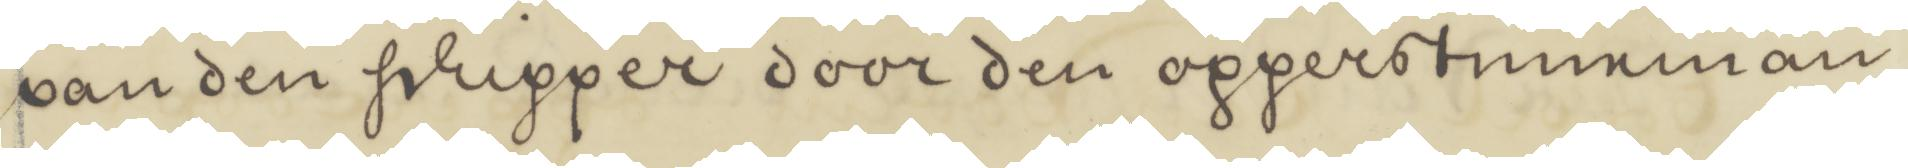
van den schipper door den opperstuurman
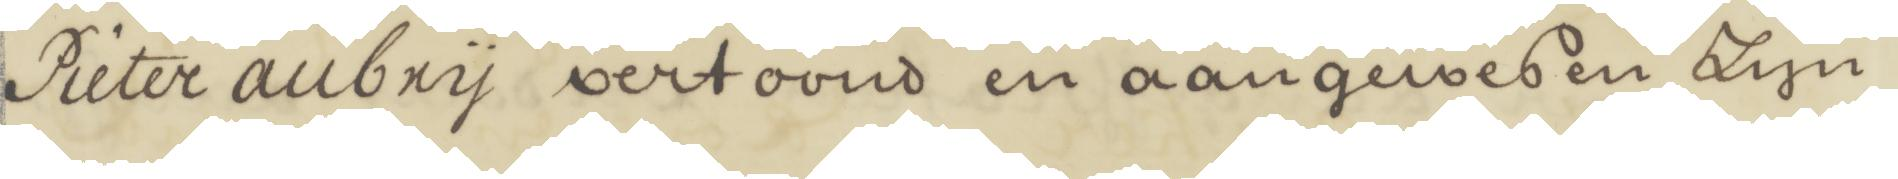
Pieter aubrij vertoond en aangewesen zyn
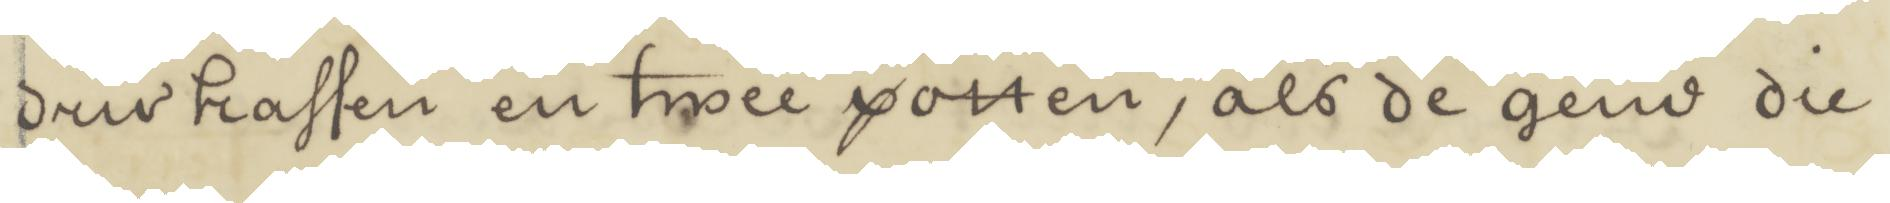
drie kassen en twee potten, als de gene die
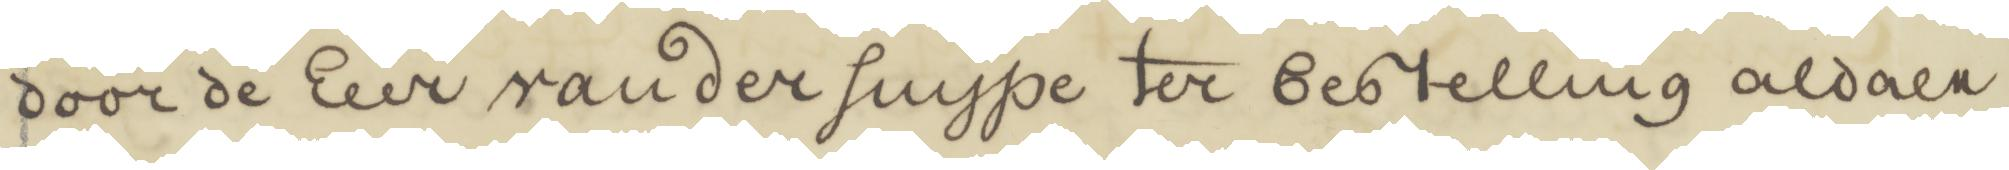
door de heer van der suijpe ter bestelling aldaer
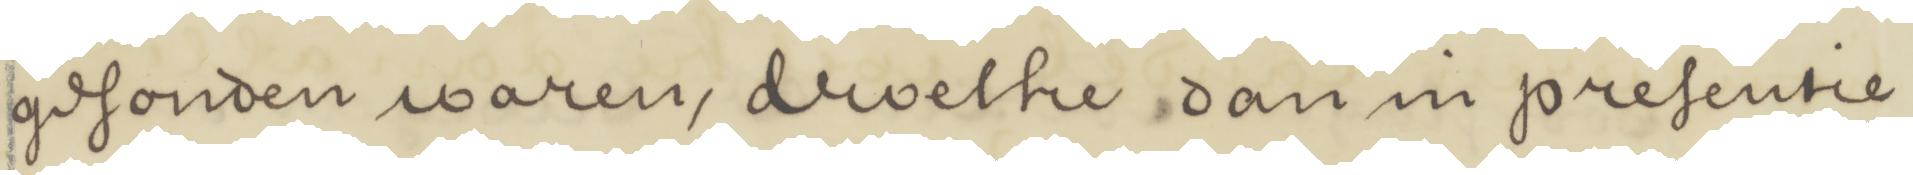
gesonden waren, dewelke dan in presentie
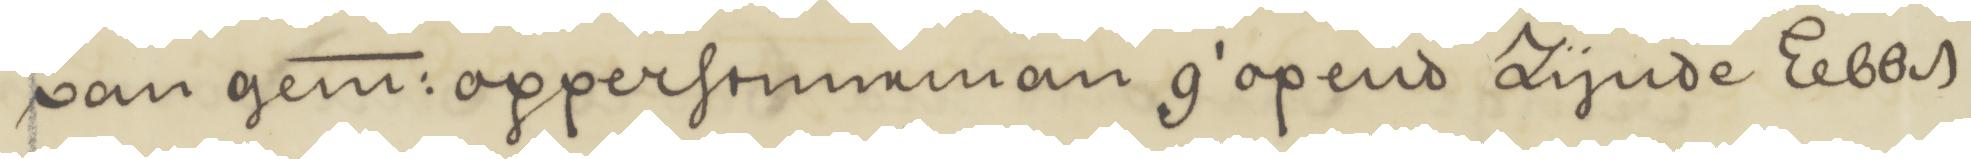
van gem: opperstuurman g’opend zijnde hebben
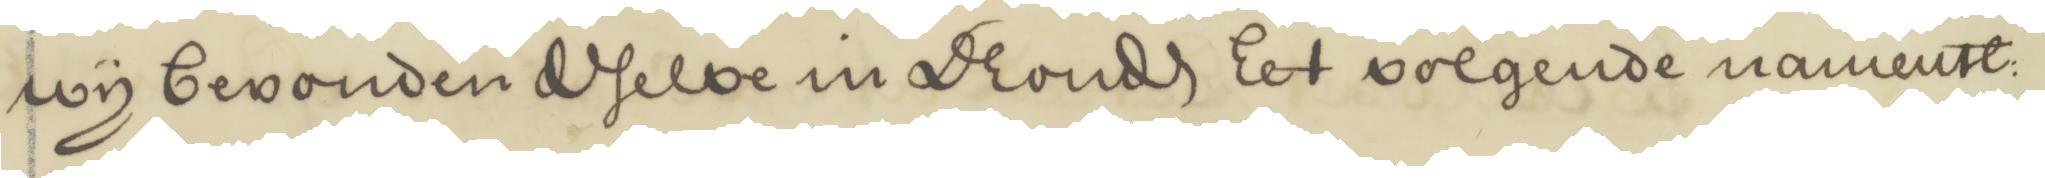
wij bevonden deselve in tehouden het volgende namentl
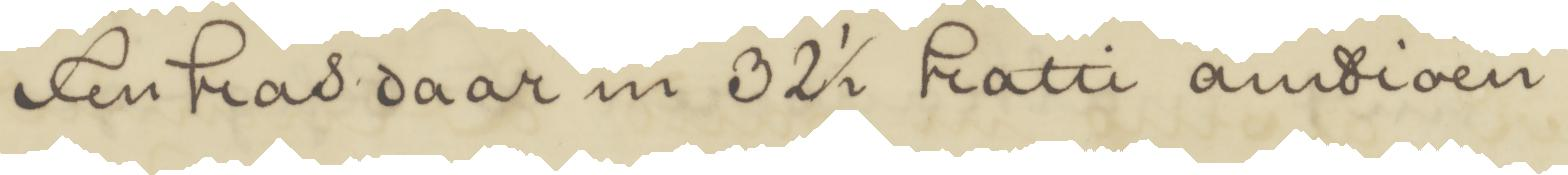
Een kas daar in 32½ katti amfioen
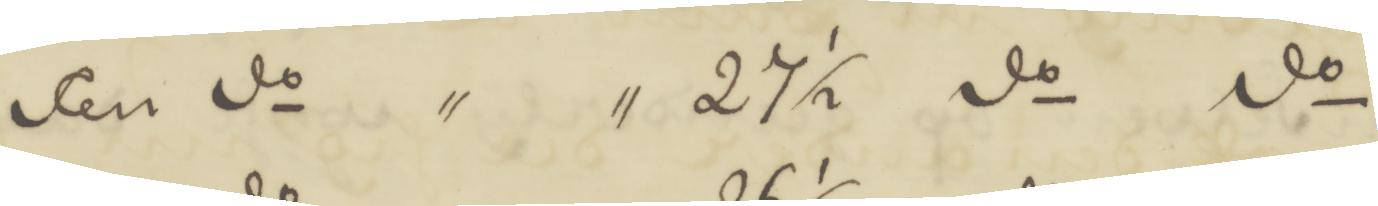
Een d_o „ „ 27½ d_o d_o
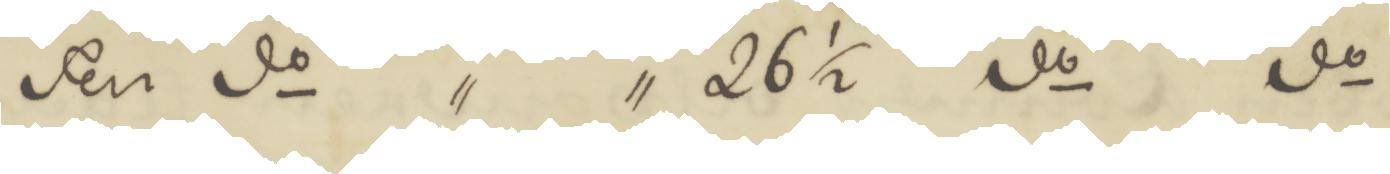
Een d_o „ „ 26½ d–o d_o
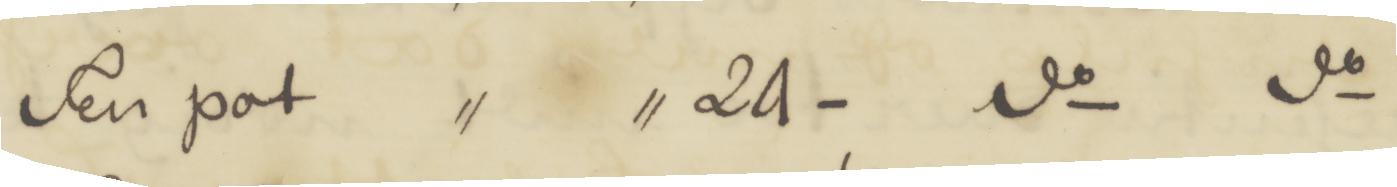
Een pot „ „ 24 – d_o d_o
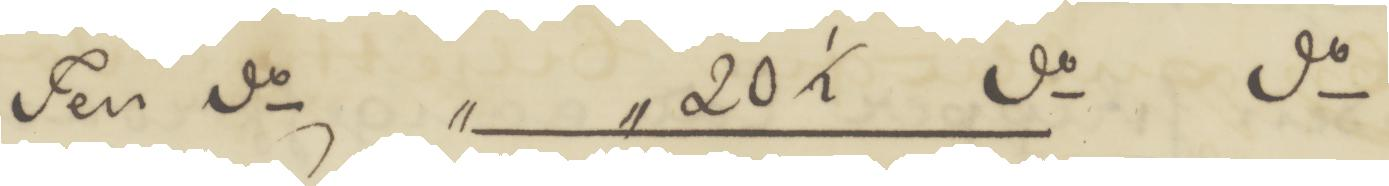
Een d_o „ „ 20½ d_o d_o
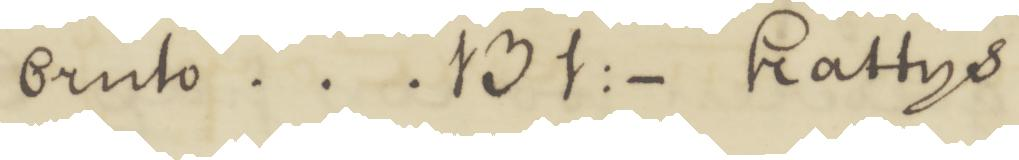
bruto . . . 131: — kattys
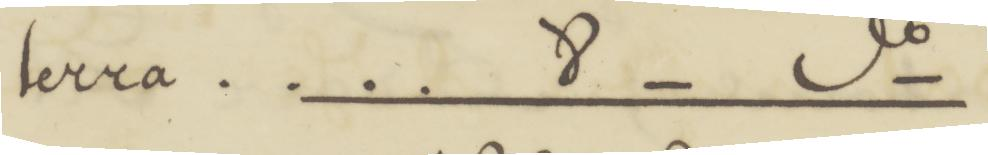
terra . . . . 8 — d_o
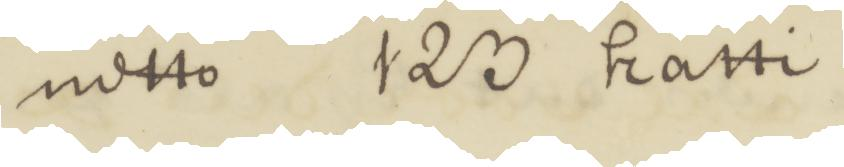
netto 123 katti
